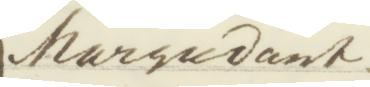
Margadant
